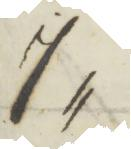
7 „
